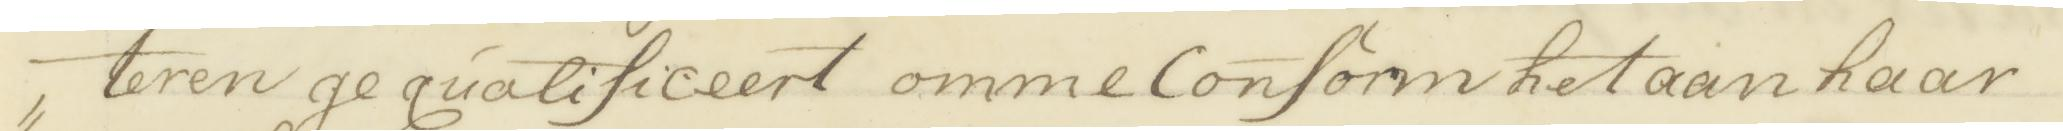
„ teren gequalificeert omme conform het aan haar
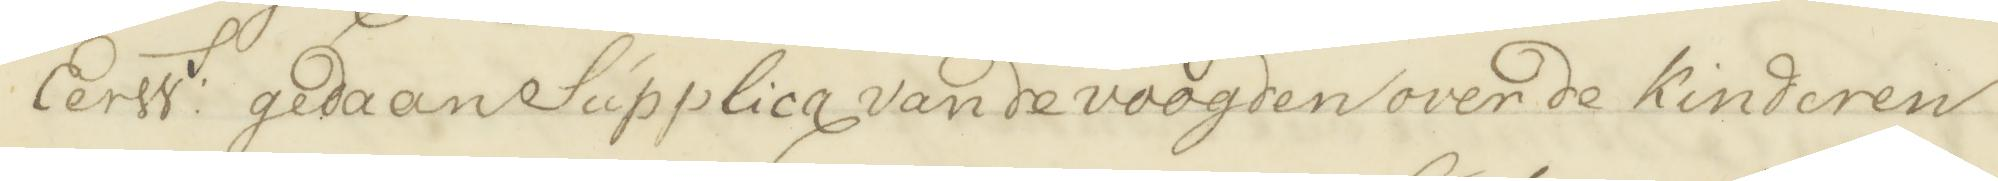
Eerw:s gedaan supplicq van de voogden over de kinderen
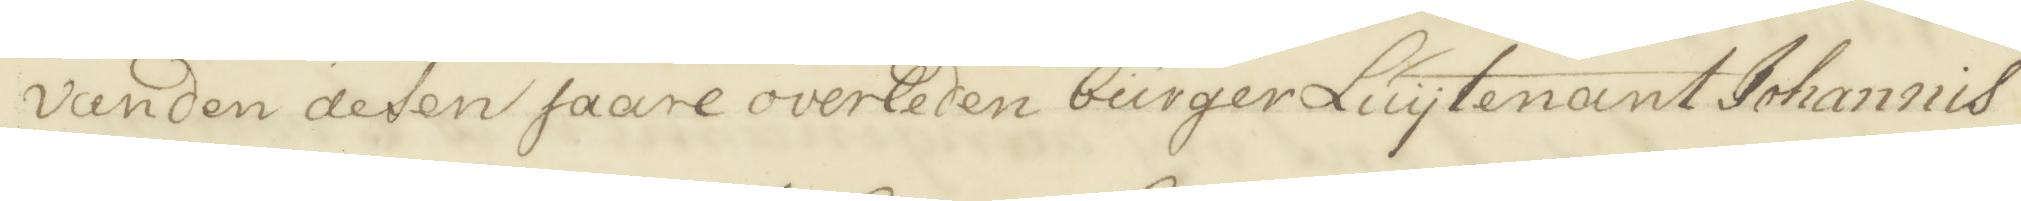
van den desen jaare overleden burger Luijtenant Iohannis
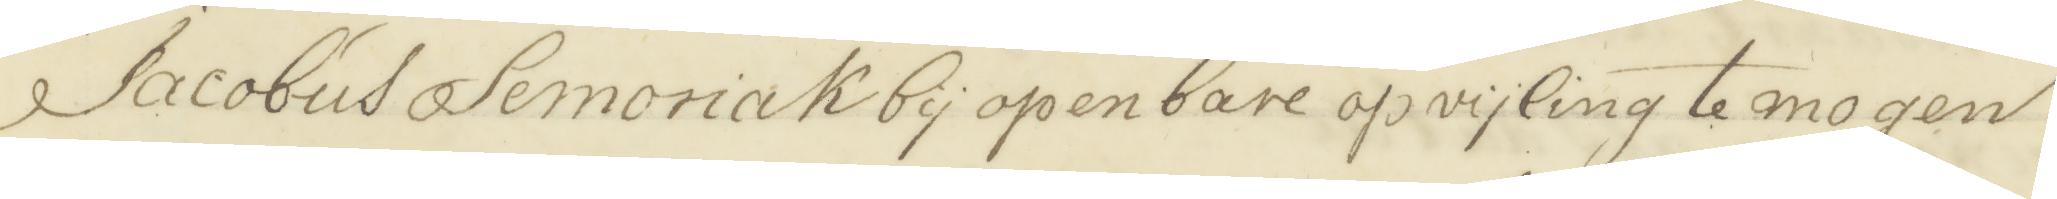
Iacobus Semoriak bij openbare opvijling te mogen
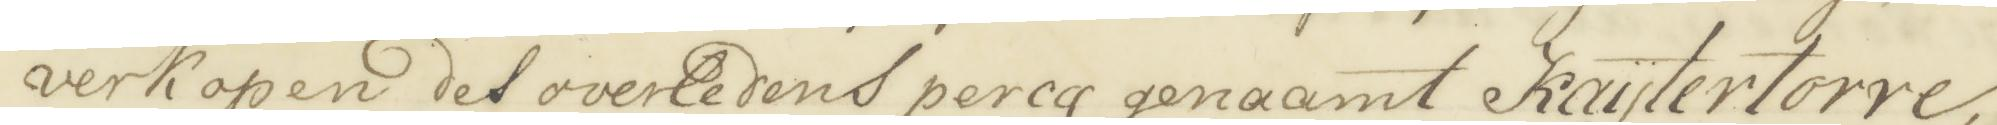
verkopen des overledens percq genaamt Kaijtertorre,
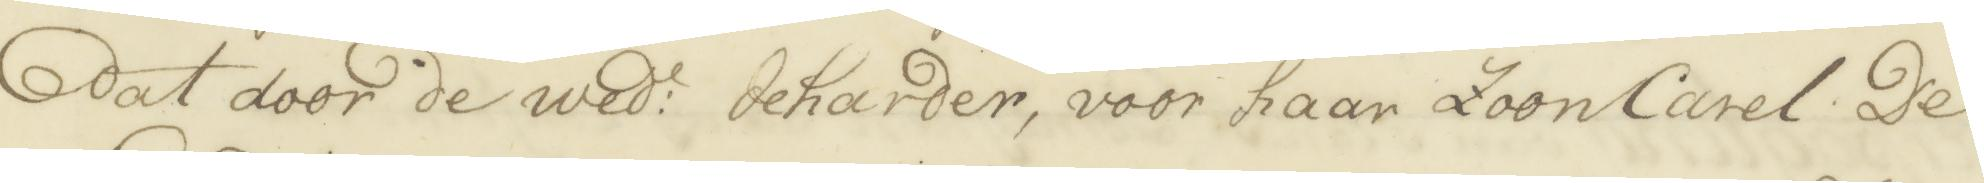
dat door de wed:e deharder, voor haar zoon Carel De
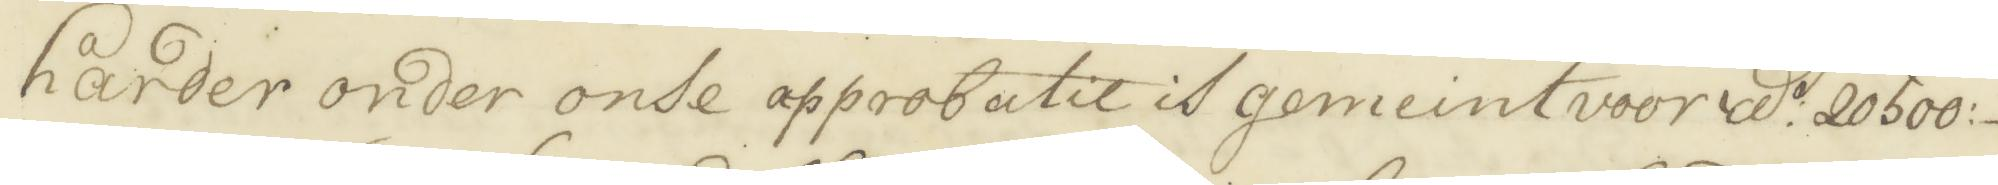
harder onder onse approbatie is gemeint voor rd:s 20500:
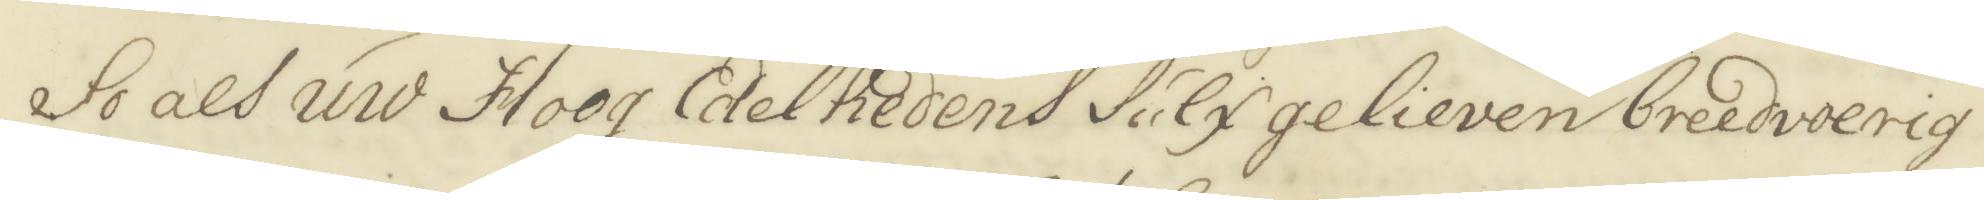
So als uw Hoog Edelhedens sulx gelieven breedvoerig
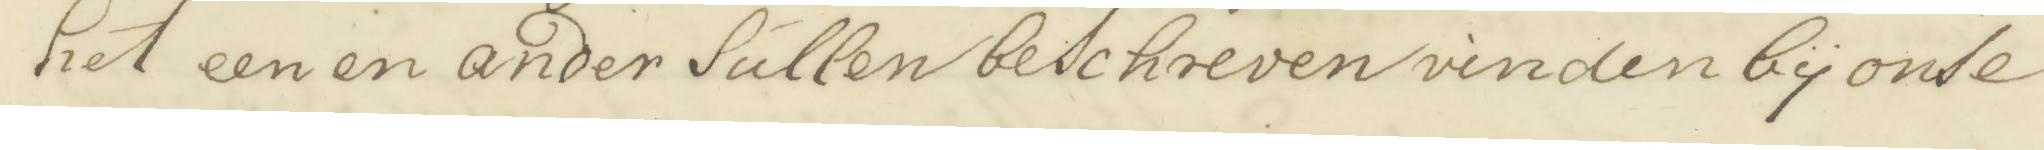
het een en ander sullen beschreven vinden bij onse
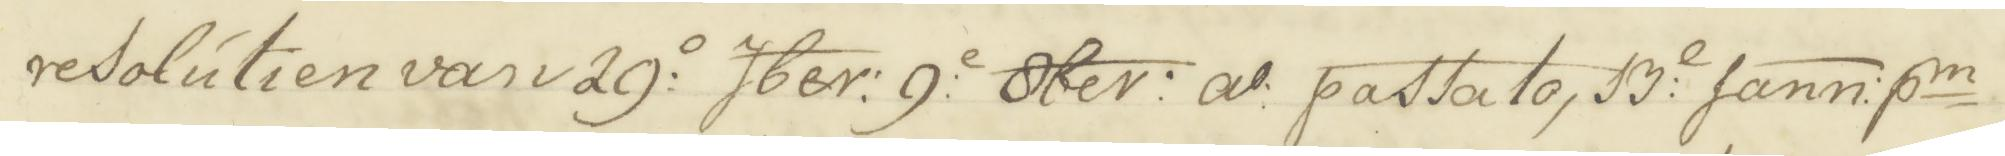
resolutien van 29:o Jber: 9:e 8ber: a:o passato, 13:e Jann: p=m
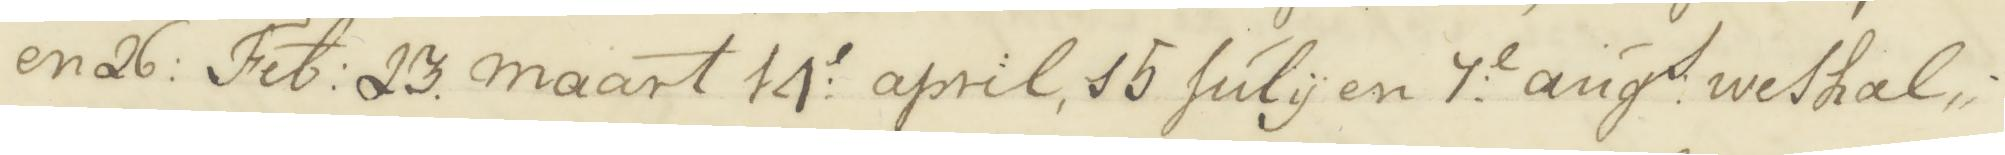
en 26: Feb: 23. maart 14:e april, 15 Julij en 7:e aug:s weshal„
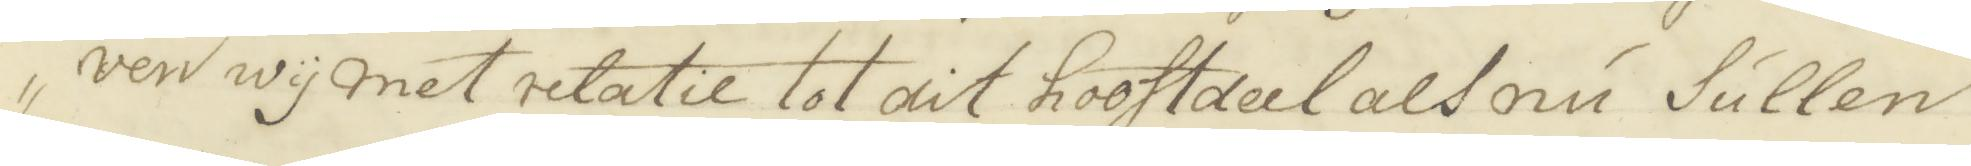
„ ven wij met relatie tot dit hooftdeel als nu sullen
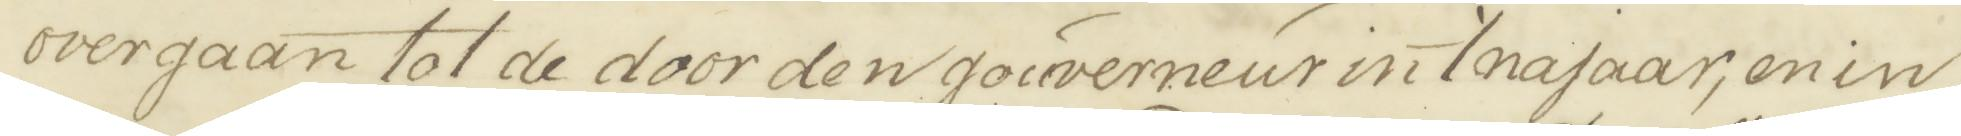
overgaan tot de door den gouverneur in ’t najaar, en in
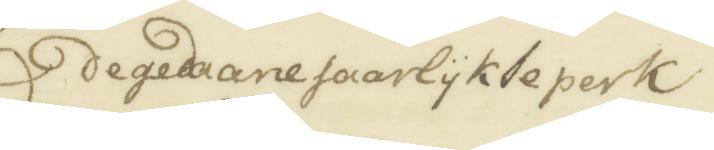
de gedaane jaarlijkse perk
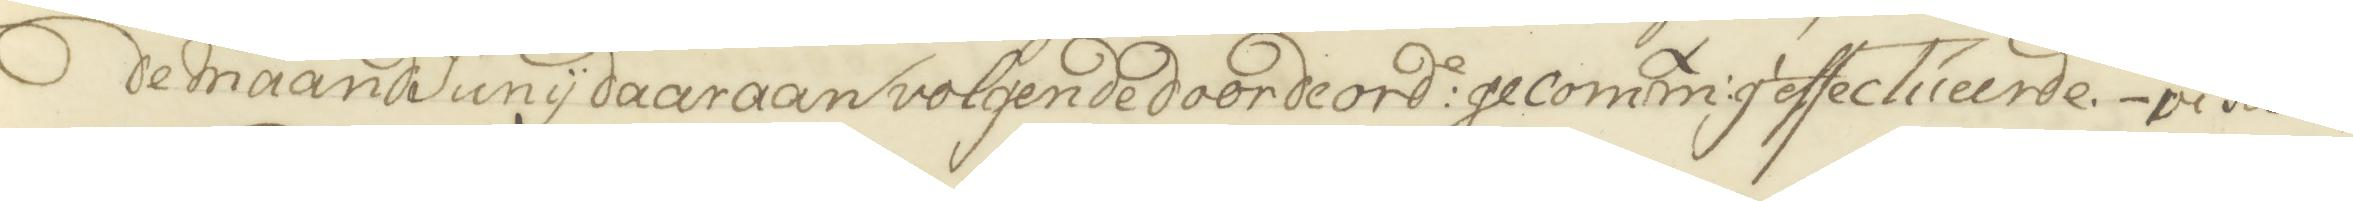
de maand Iunij daar aan volgende door de ord:e gecomm: g'effectueerde. -visite.
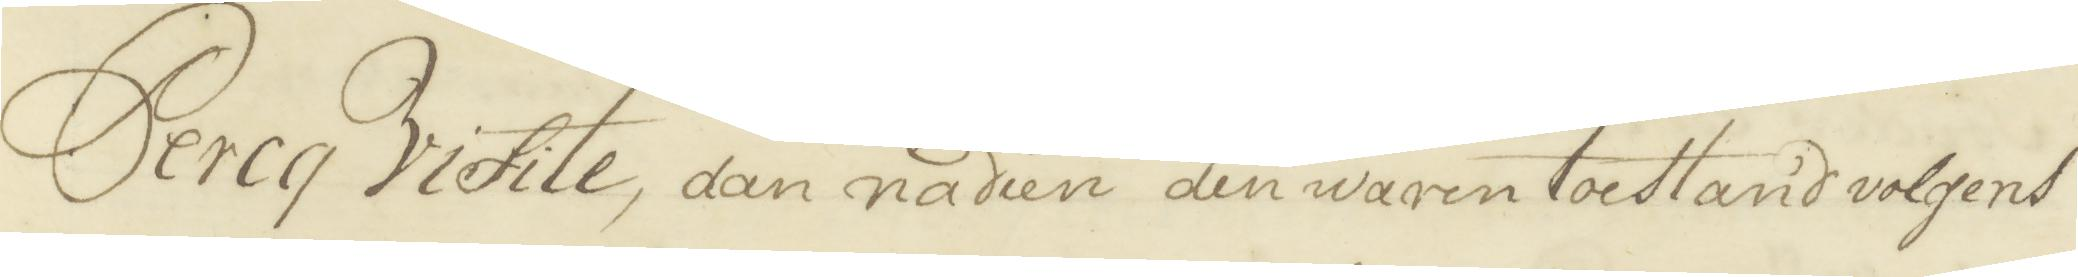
Percq Visite, dan nadien den waren toestand volgens
